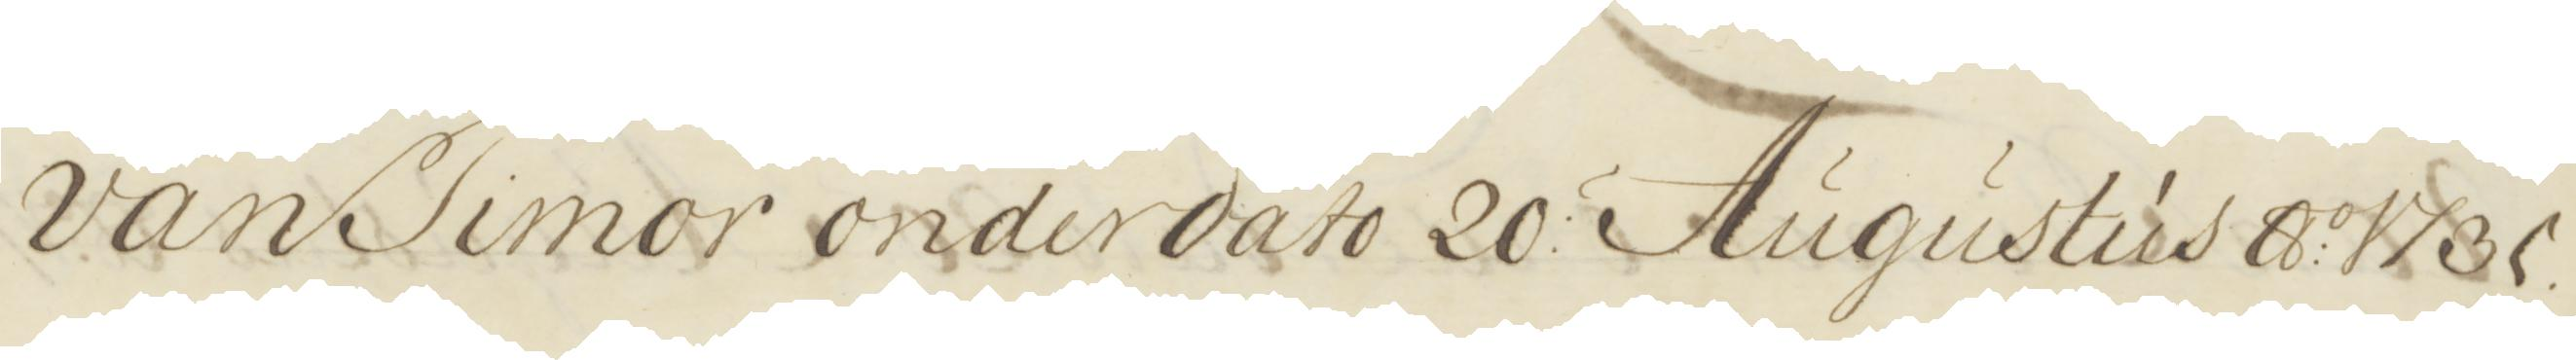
van Timor onder dato 20:' Augustus a:o 1735.
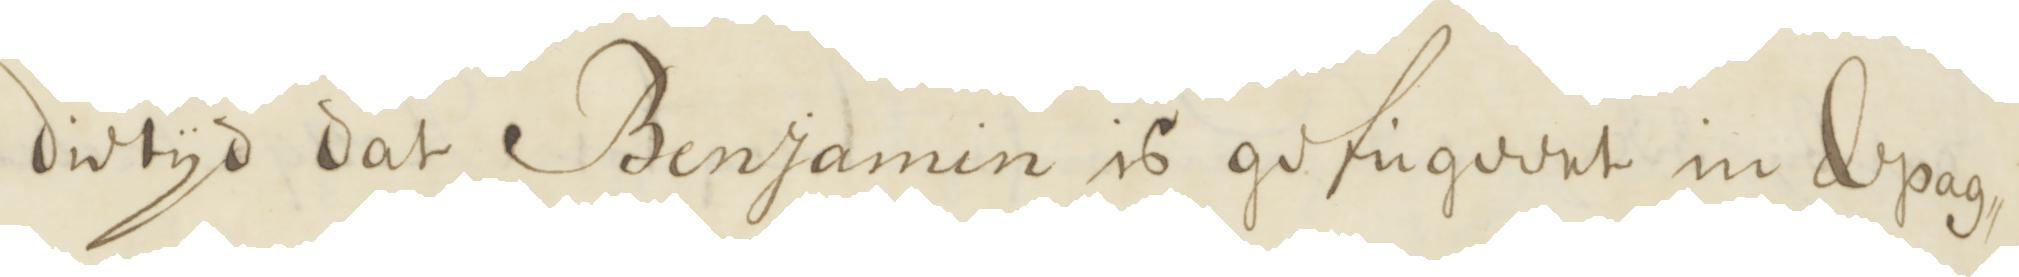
die tijd dat Benjamin is gefugeert in depag„
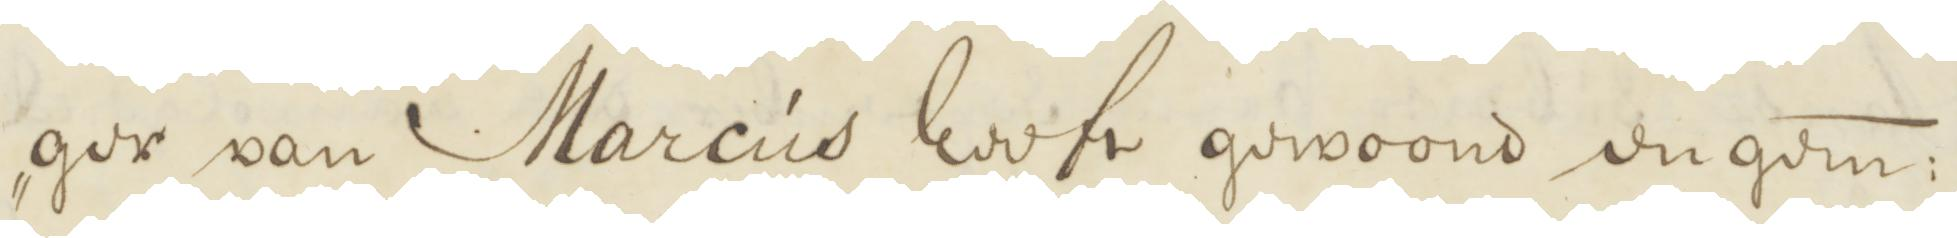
„ger van Marcus heeft gewoond en gem:
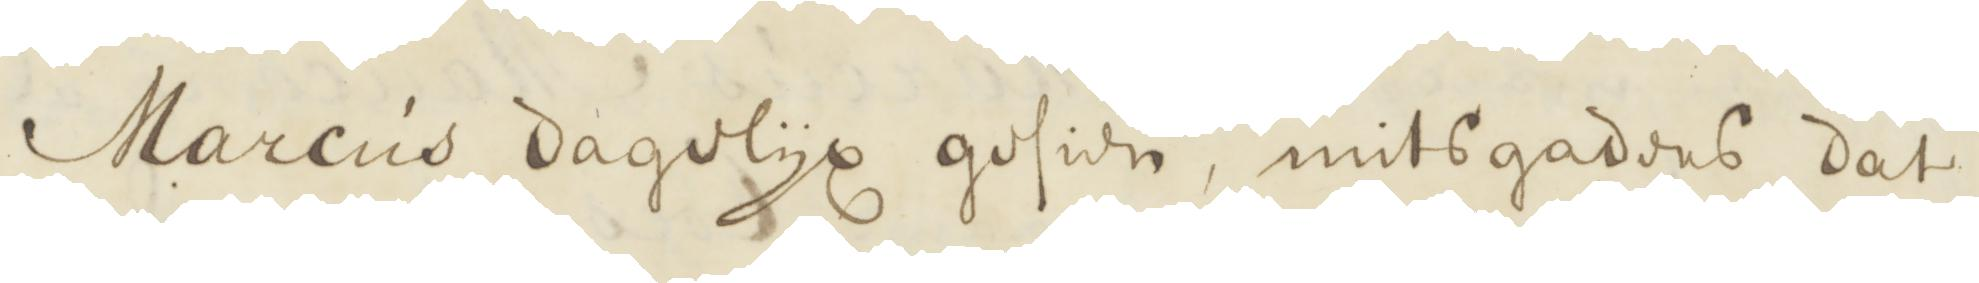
Marcus dagelijx gesien, mitsgaders dat
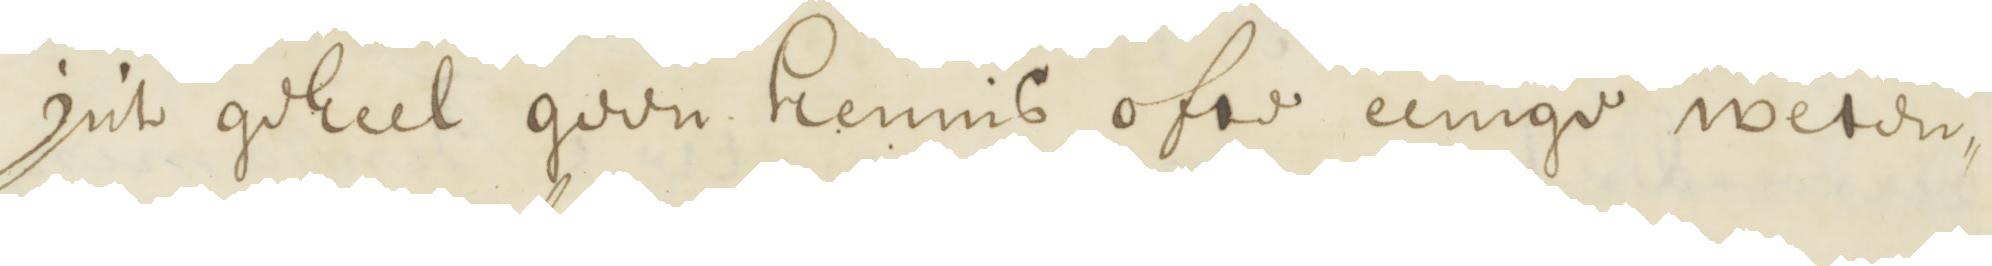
jn't geheel geen kennis ofte eenige weten„
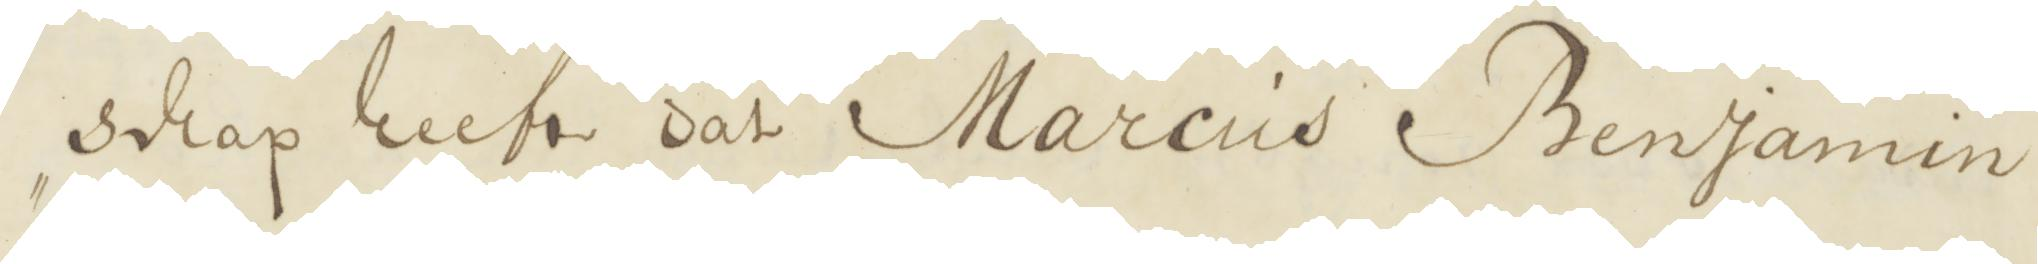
„schap heeft dat Marcus Benjamin
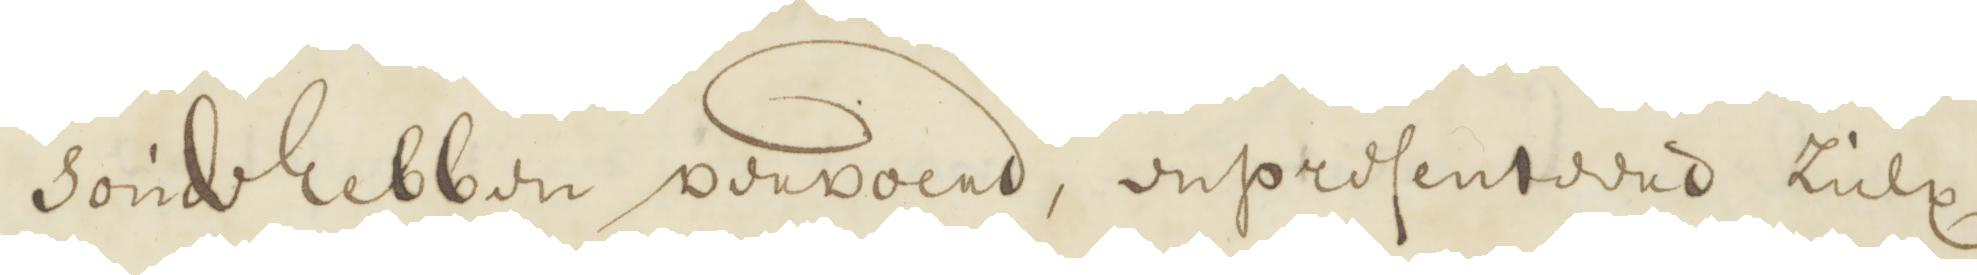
soude hebben vervoerd, en presenteerd zulx
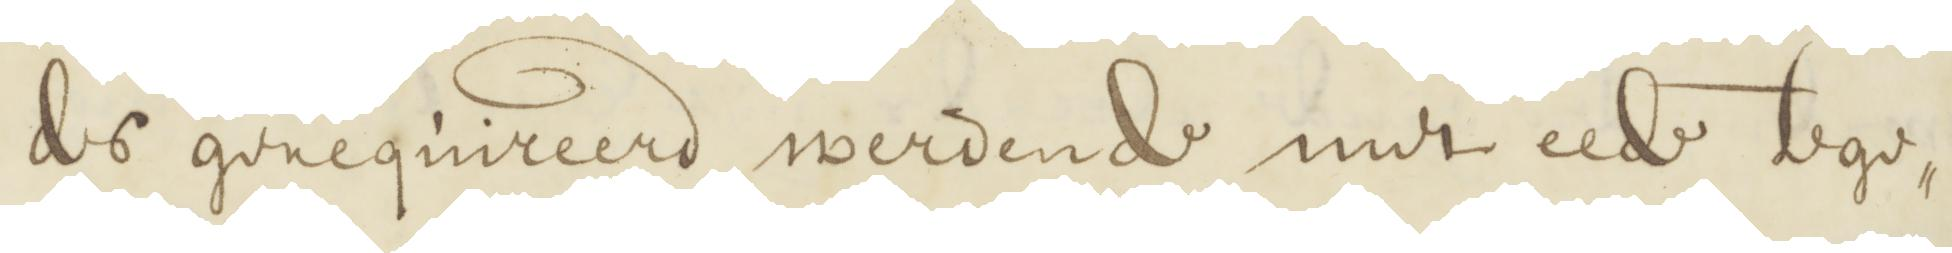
des gerequireerd werdende met eede tege„
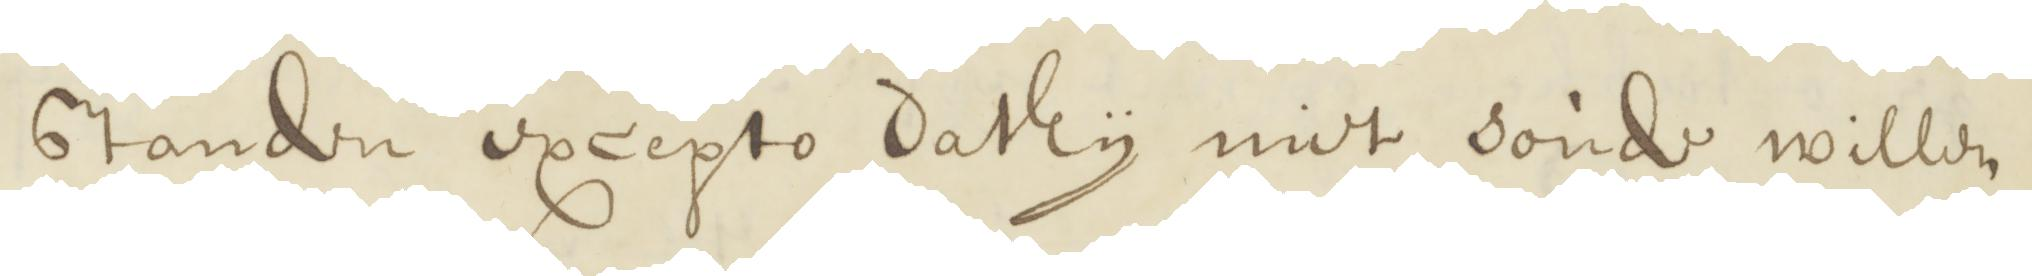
standen excepto dat hij niet soude willen
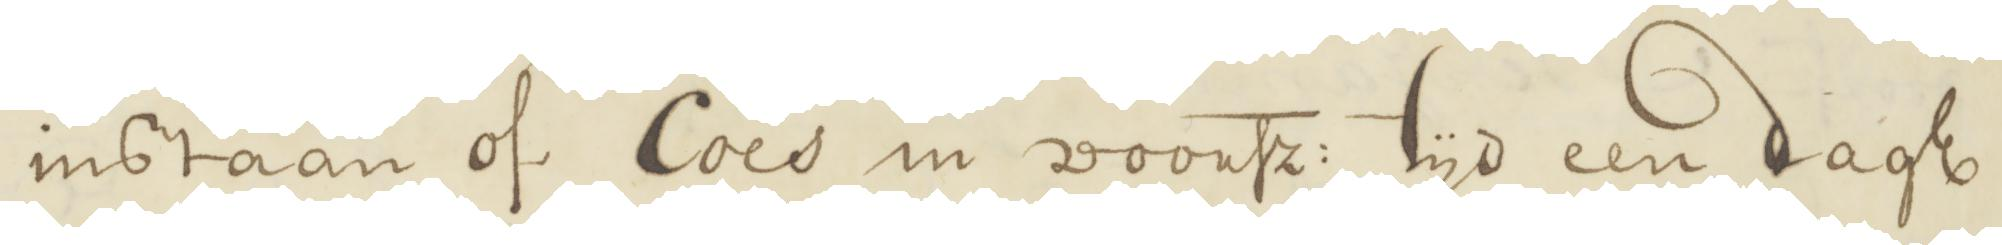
instaan of Coes in voorsz: tijd een dagh
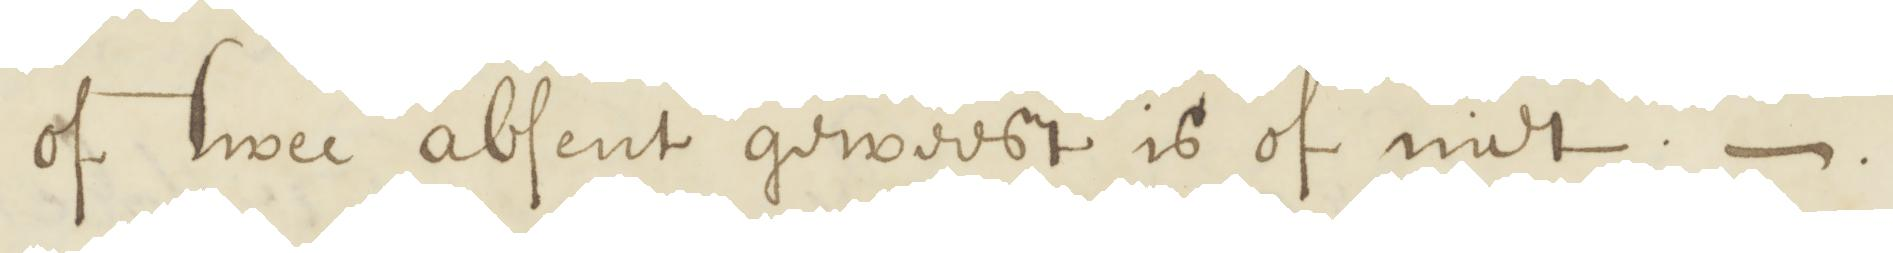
of twee absent geweest is of niet; —.
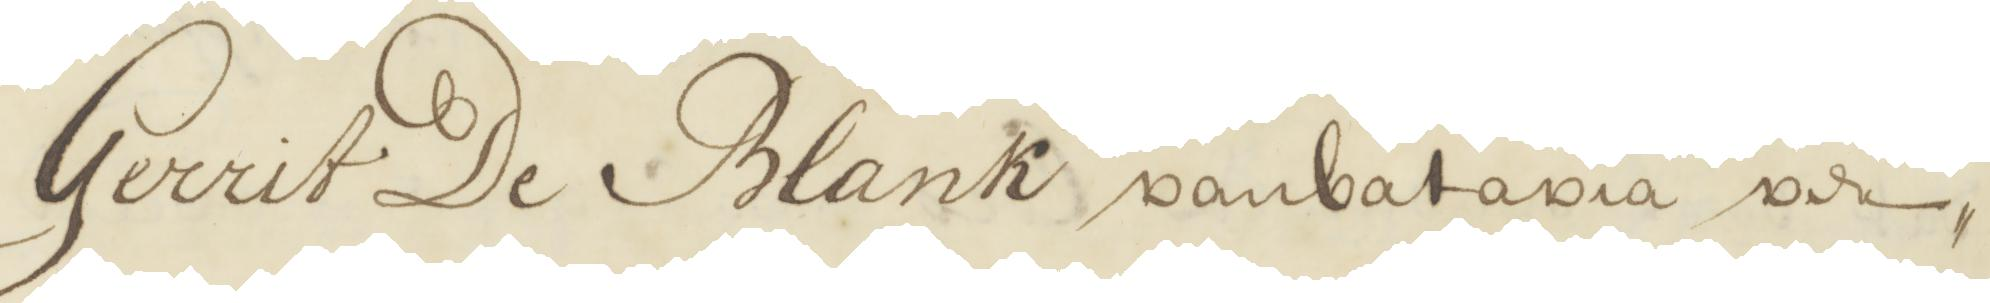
Gerrit De Blank van batavia ver„
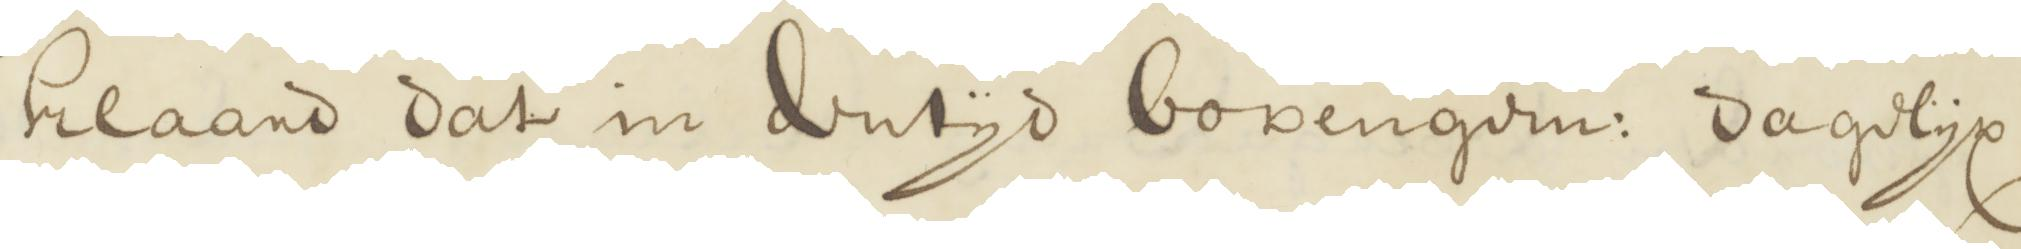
klaard dat in den tijd bovengem: dagelijx
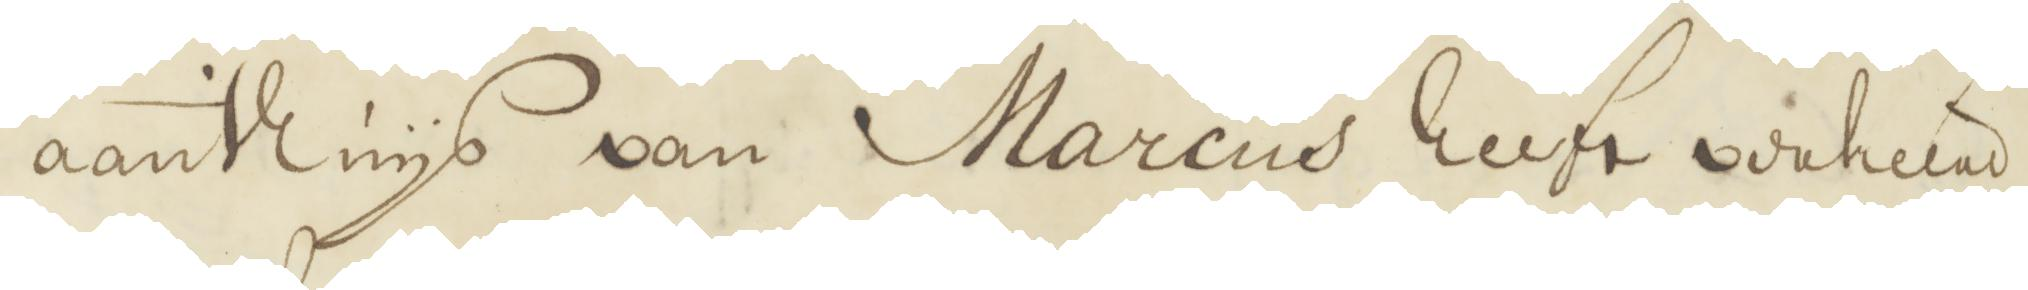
aan't huijs van Marcus heeft verkeerd
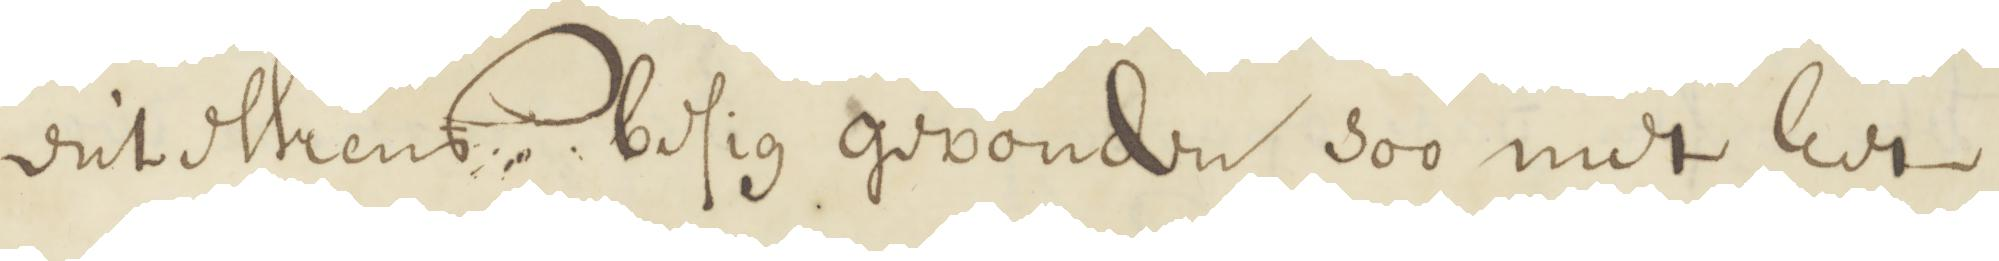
en'telkens besig gevonden soo met het
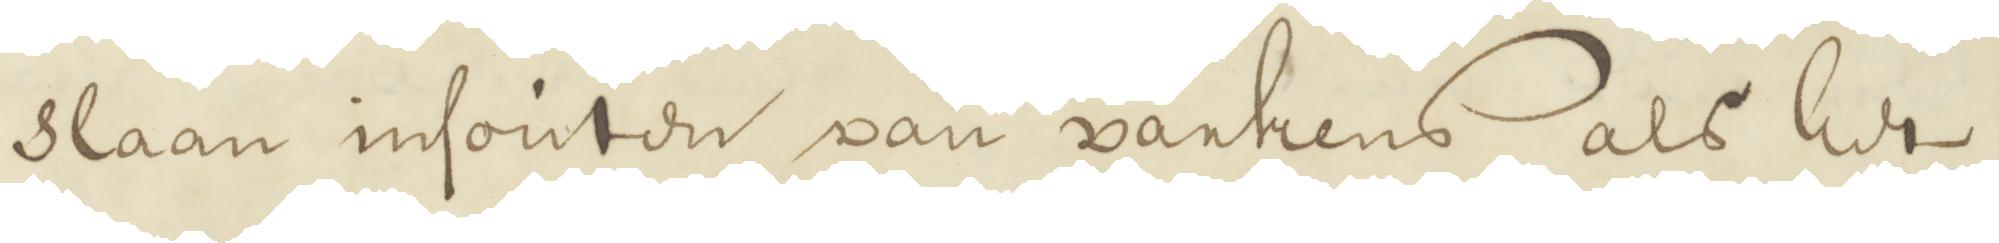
slaan insouten van varkens als het
